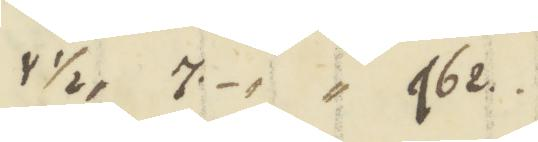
1½„ 7. – „ „ 462. .
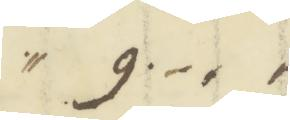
.„ 9. – „
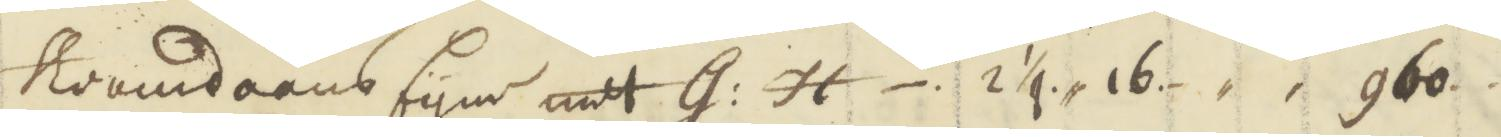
therindaans fijne met 9: H — . 2¼.„ 16. - „ „ 960.
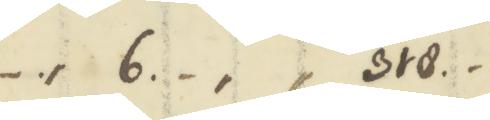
. „ 6. - „ „ 318. -
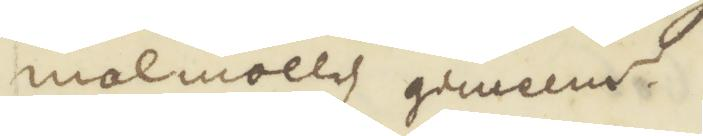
malmollen gemeene -
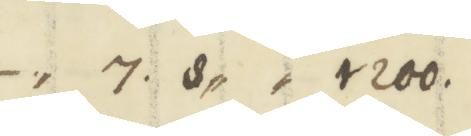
„ 7. 8„ „ 1200.
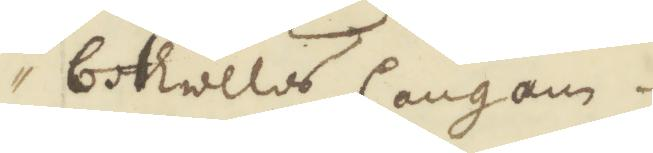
„ bethelles Cangam
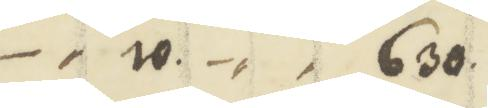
„ 10. – „ „ 630.
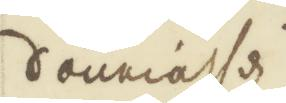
douriasen
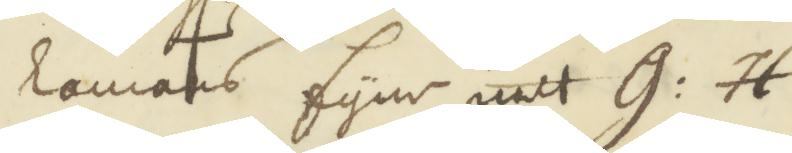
hamans fijne met 9: H
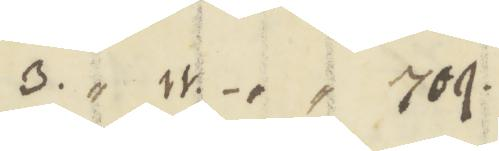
3. „ 11. – „ „ 704
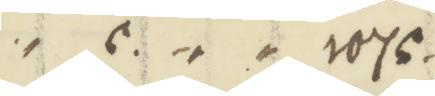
. „ 5. „ „ 1075
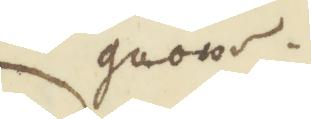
grote -
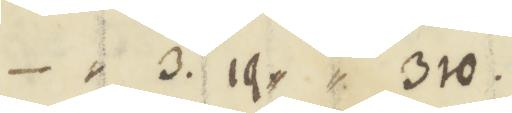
— „ 3. 14 „ „ 310.
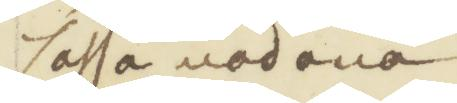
Cassa nadana
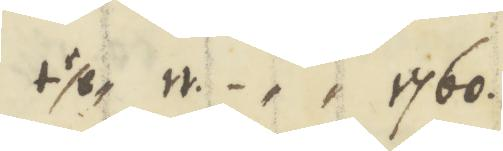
1 5/8„ 11. – „ „ 1760
